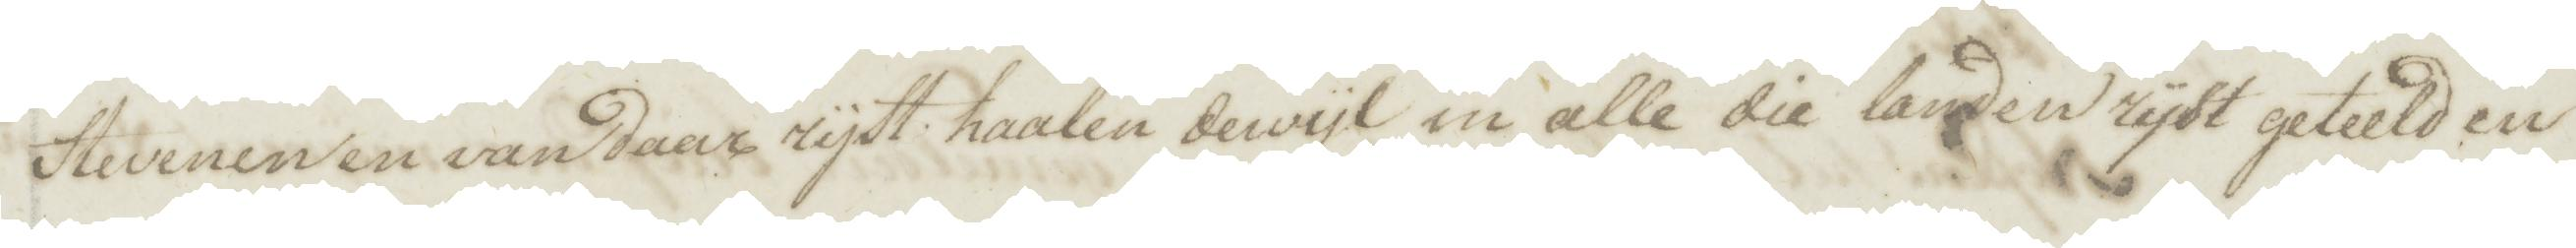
stevenen en van daar rijst haalen dewijl in alle die landen rijst geteeld en
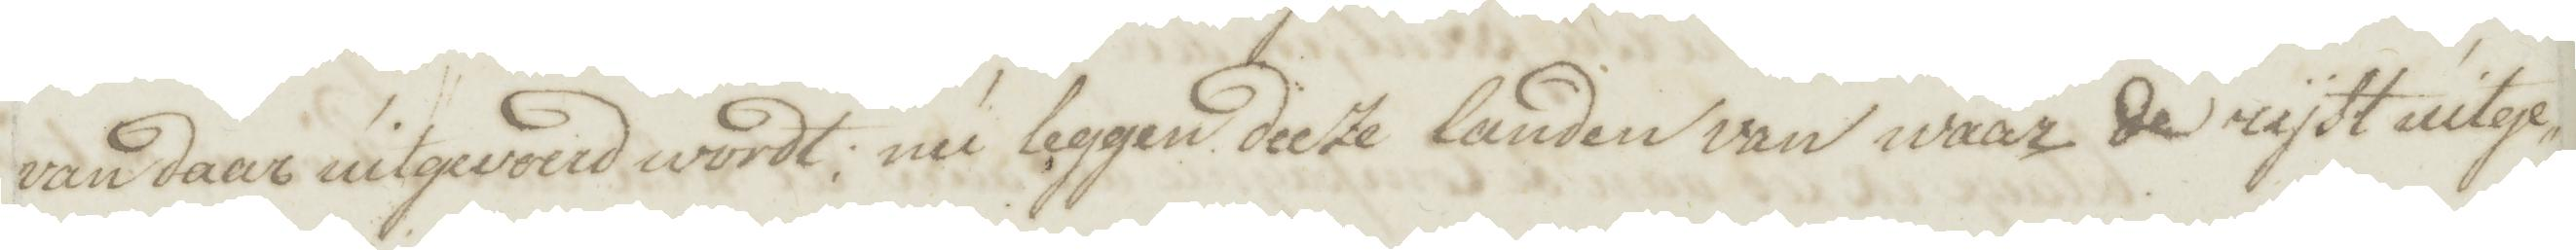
van daar uitgevoerd wordt; nu leggen deeze landen van waar de rijst uitge„
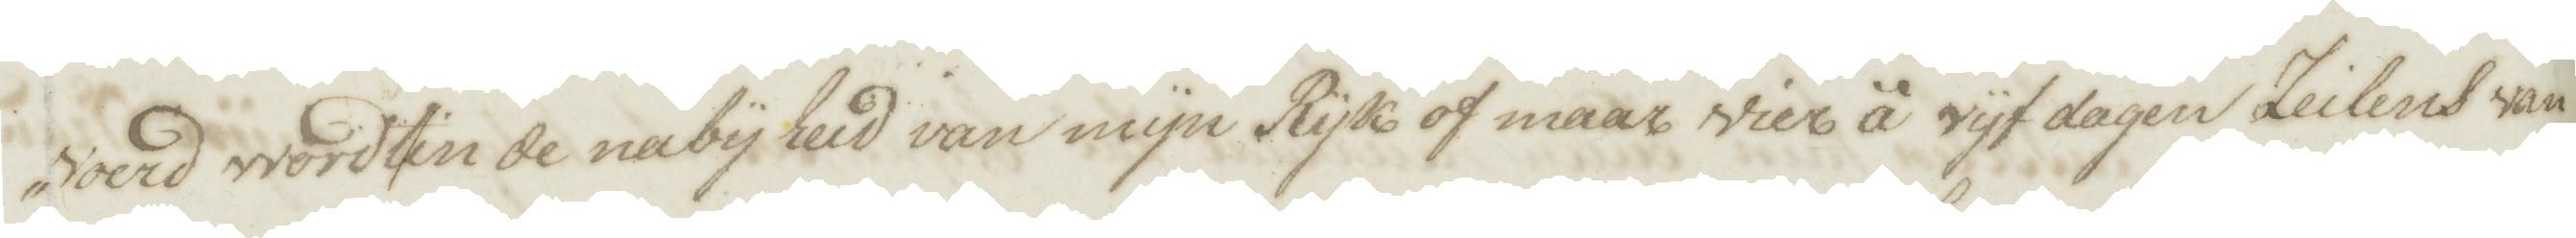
„voerd wordtin de nabijheid van mijn Rijk of maar vier â vijf dagen zeilens van
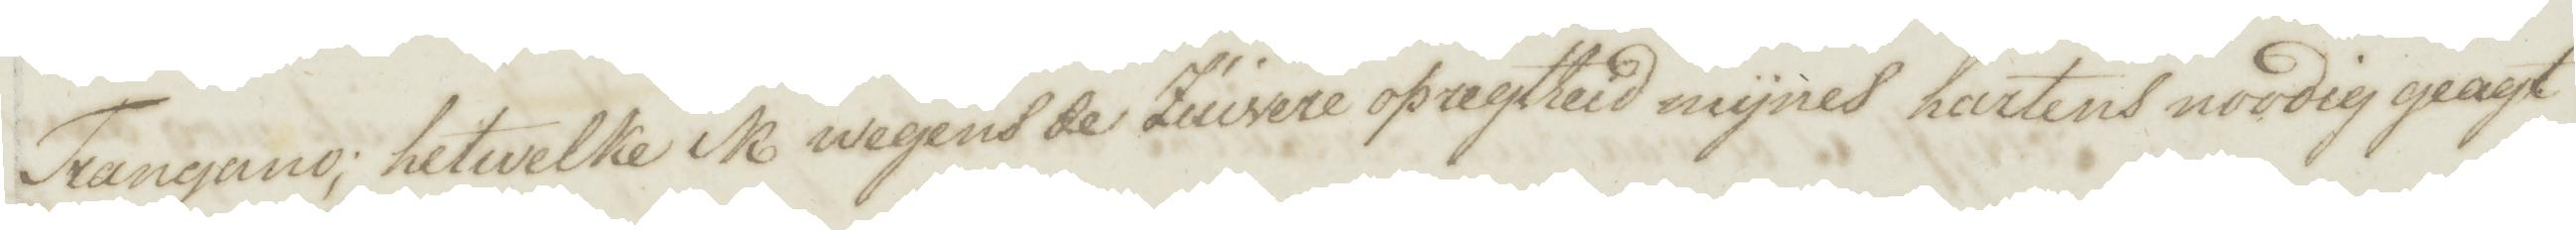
Trangano; hetwelke ik wegens de zuivere opregtheid mijnes hartens noodig geagt
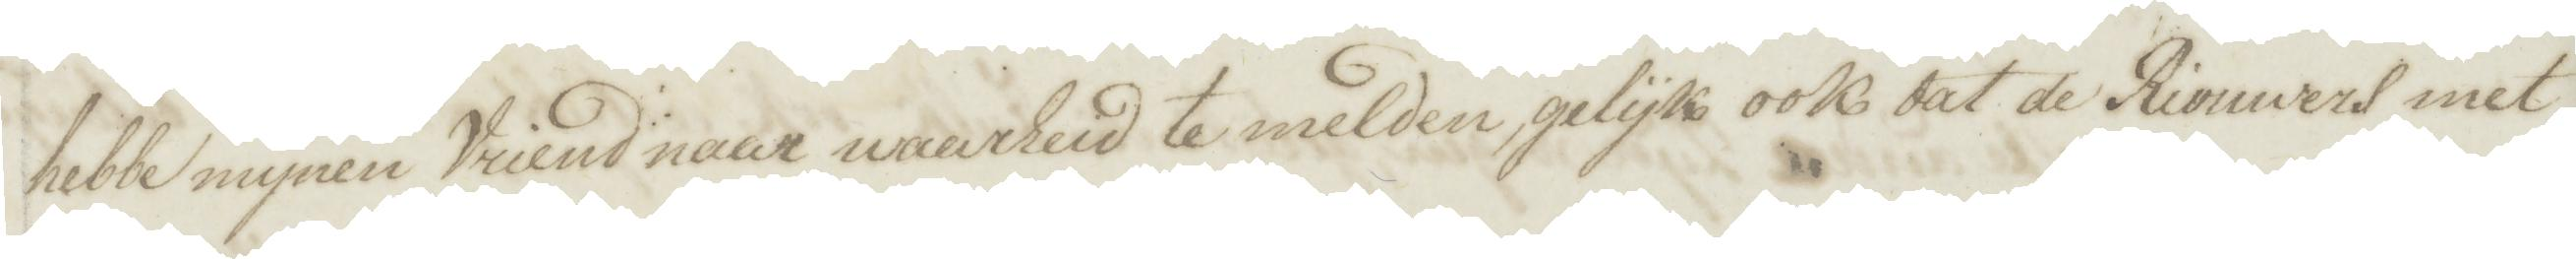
hebbe mijnen Vriend naar waarheid te melden, gelijk ook dat de Riouwers met
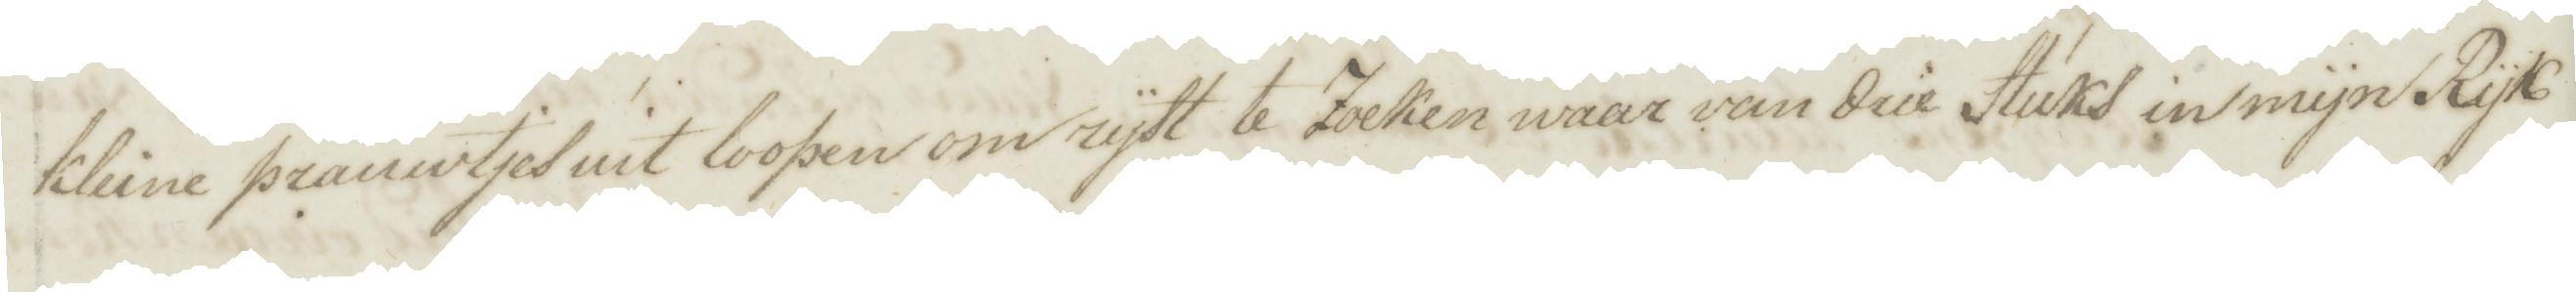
kliine prauwtjes uit loopen om rijst te zoeken waar van drie stuks in mijn Rijk
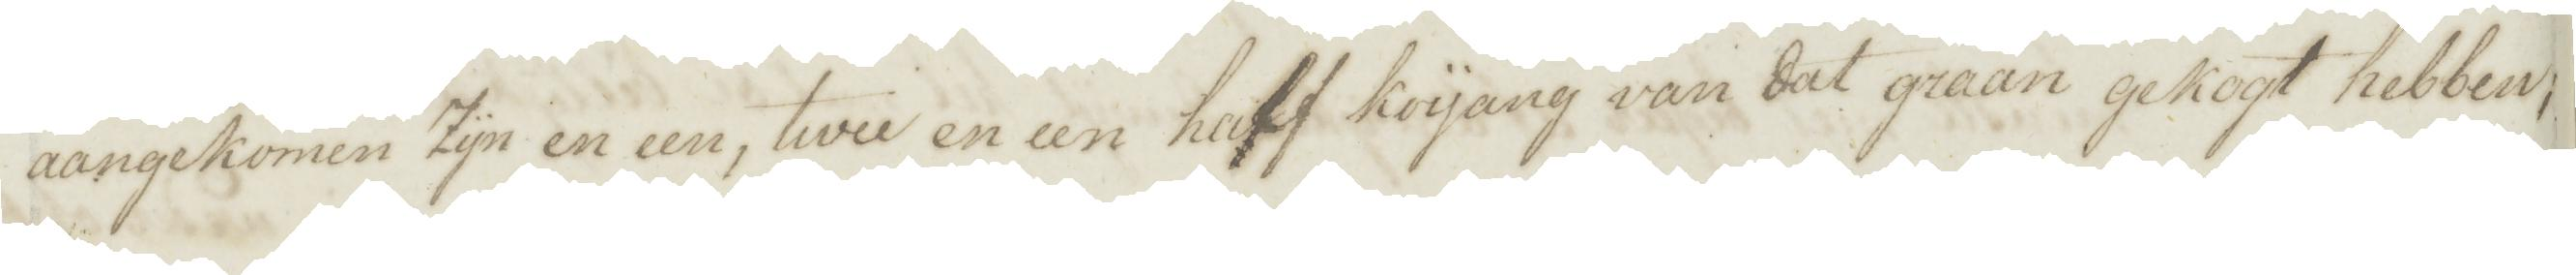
aangekomen zijn en een, twee en een haff koijang van dat graan gekogt hebben,
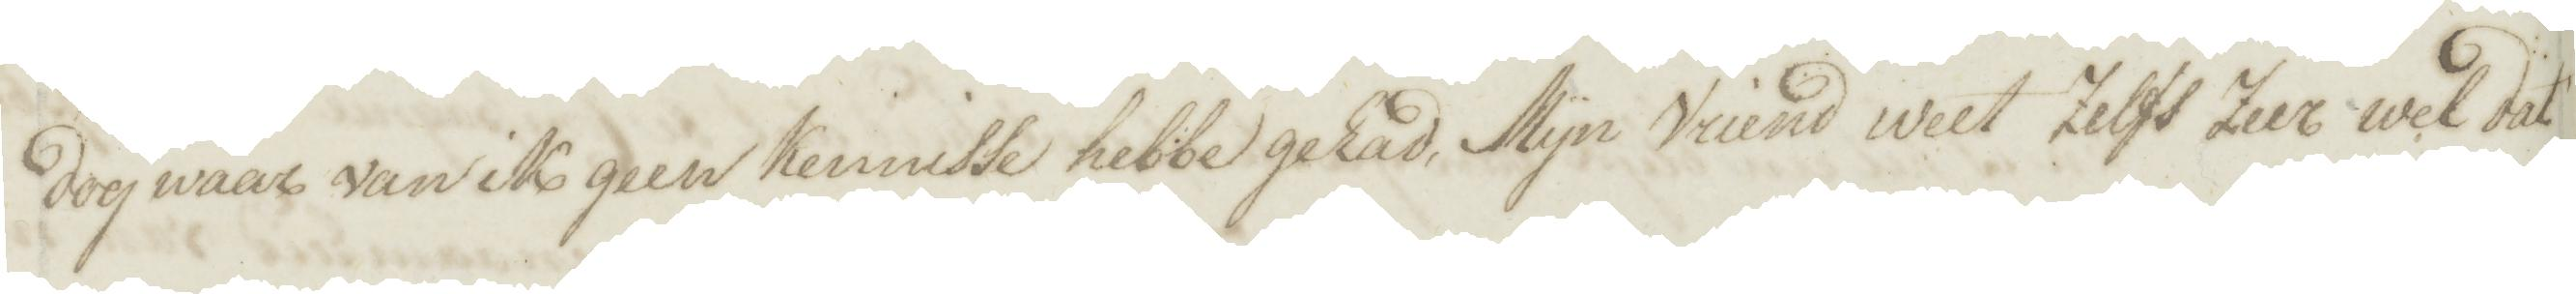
dog waar van ik geen kennisse hebbe gehad, Mijn Vriend weet zelfs zeer wel dat
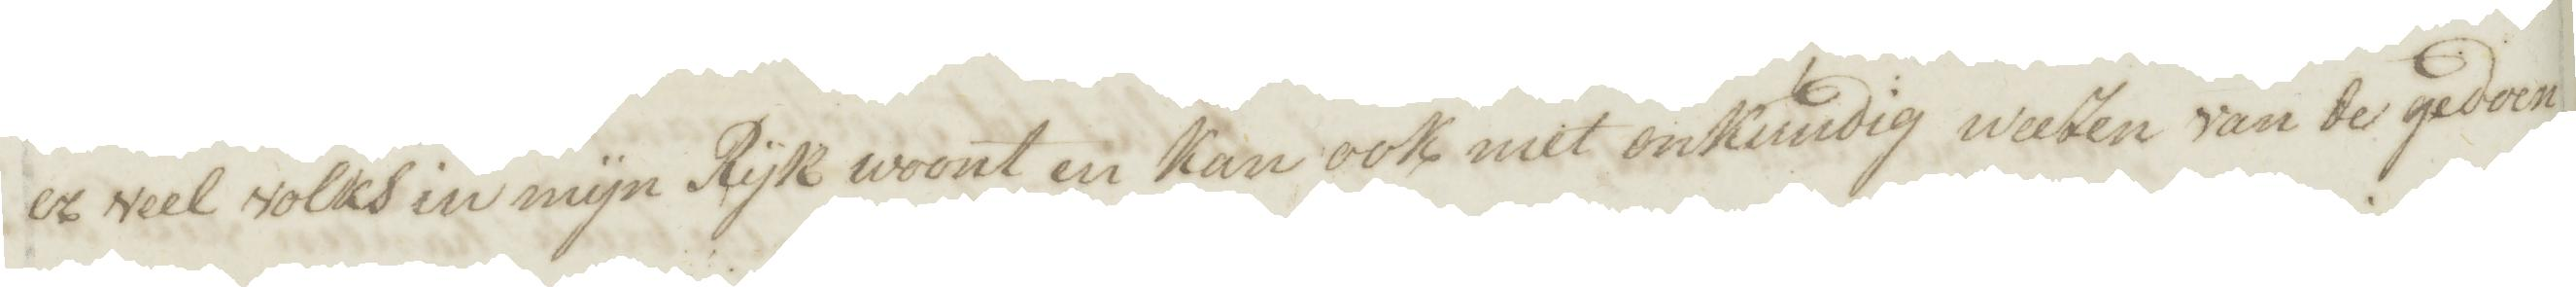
er veel volks in mijn Rijk woont en kan ook niet onkundig weeren van de gedoen
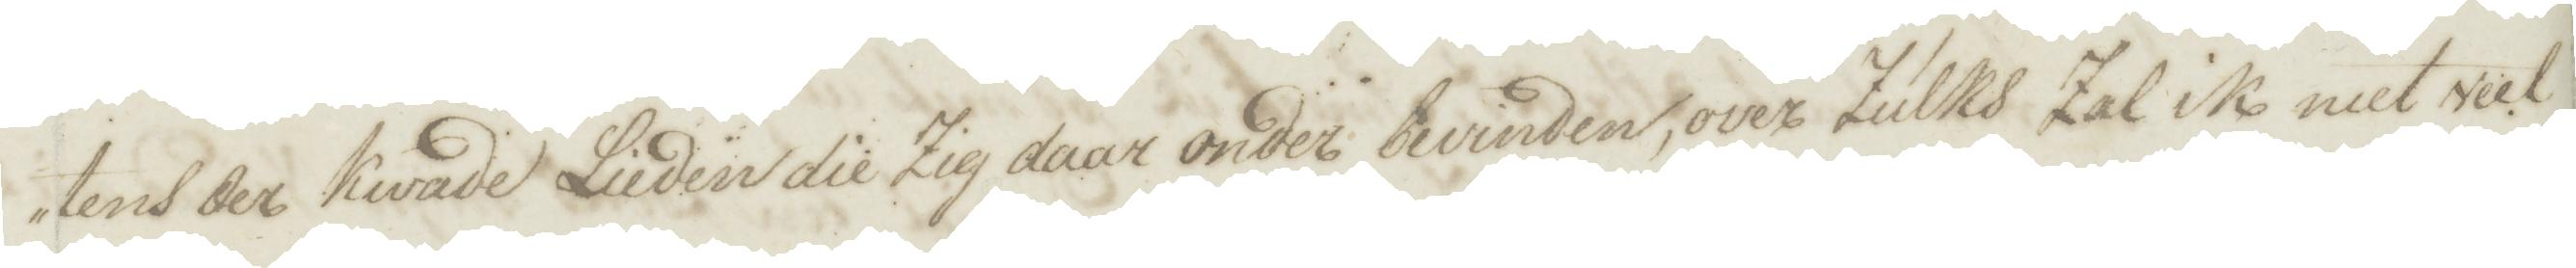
„tens der kwade Lieden die zig daar onder bevinden, over zulks zal ik niet veel
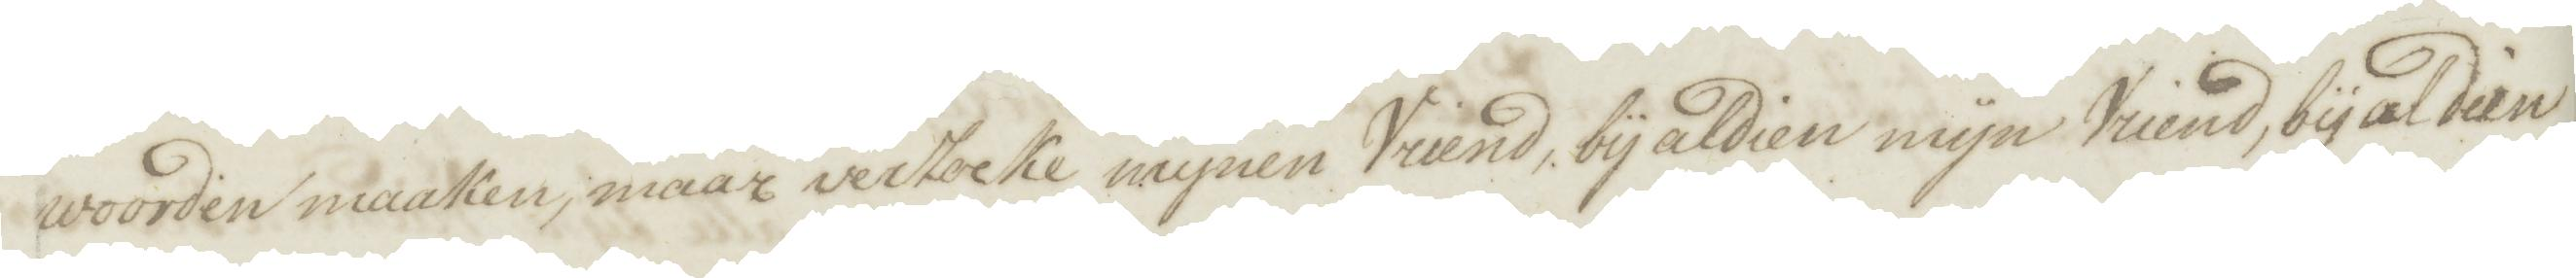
woorden maaken, maar verzoeke mijnen Vriend, bij aldien mijn Vriend, bij al dien
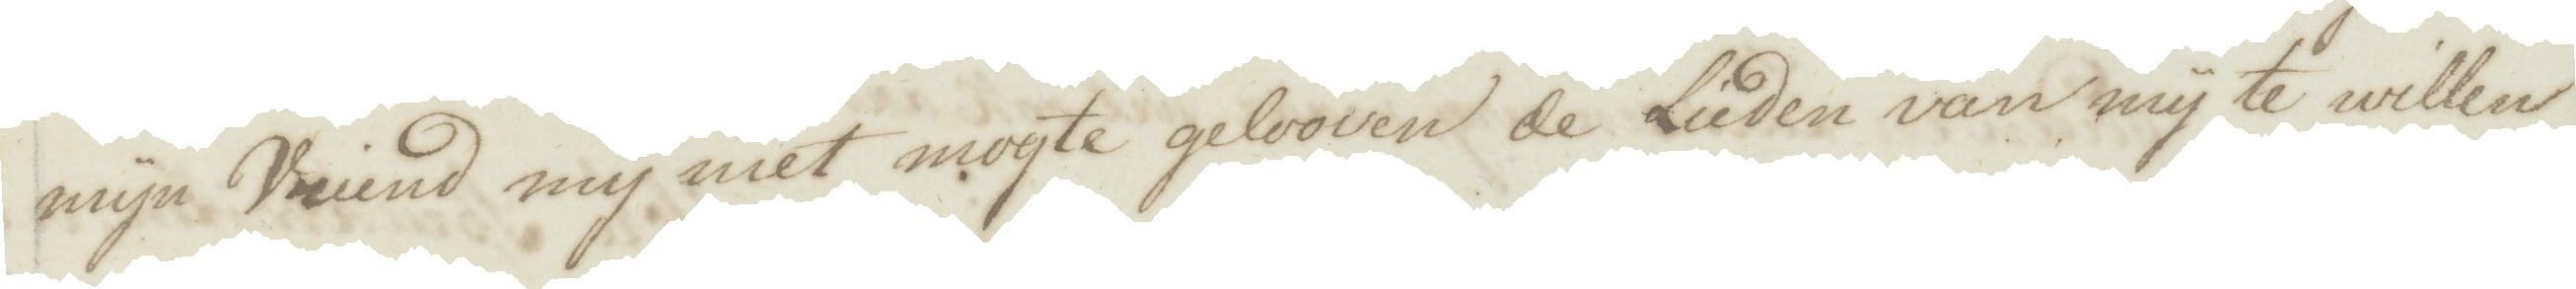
mijn Vriend mij niet mogte gelooven de Lieden van mij te willen
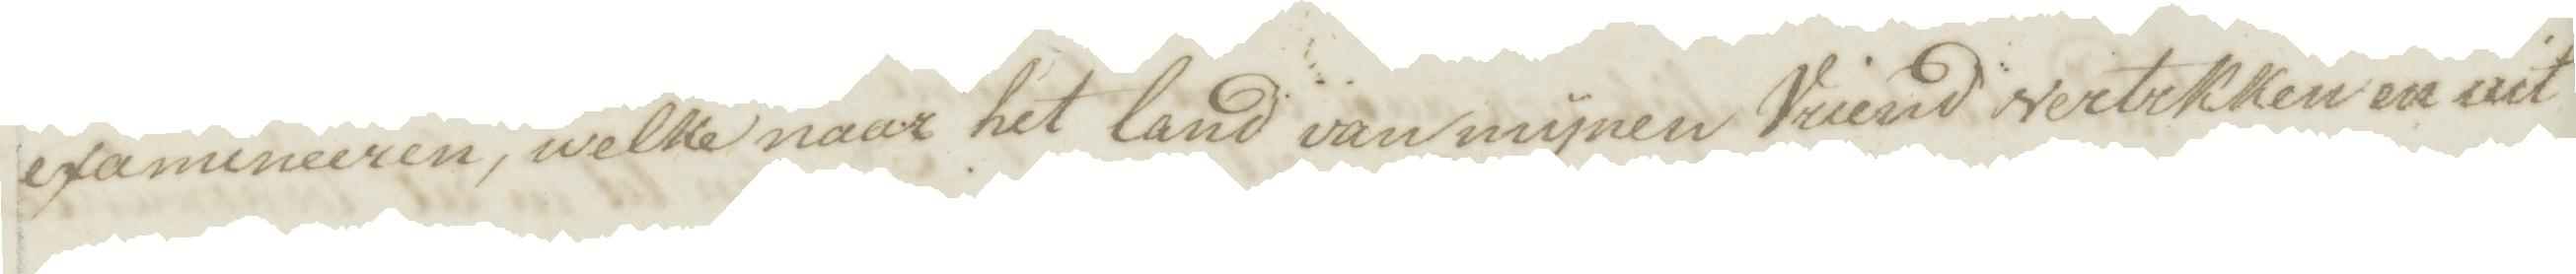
examineeren, welke naar het land van mijnen Vriend vertrkken en uit
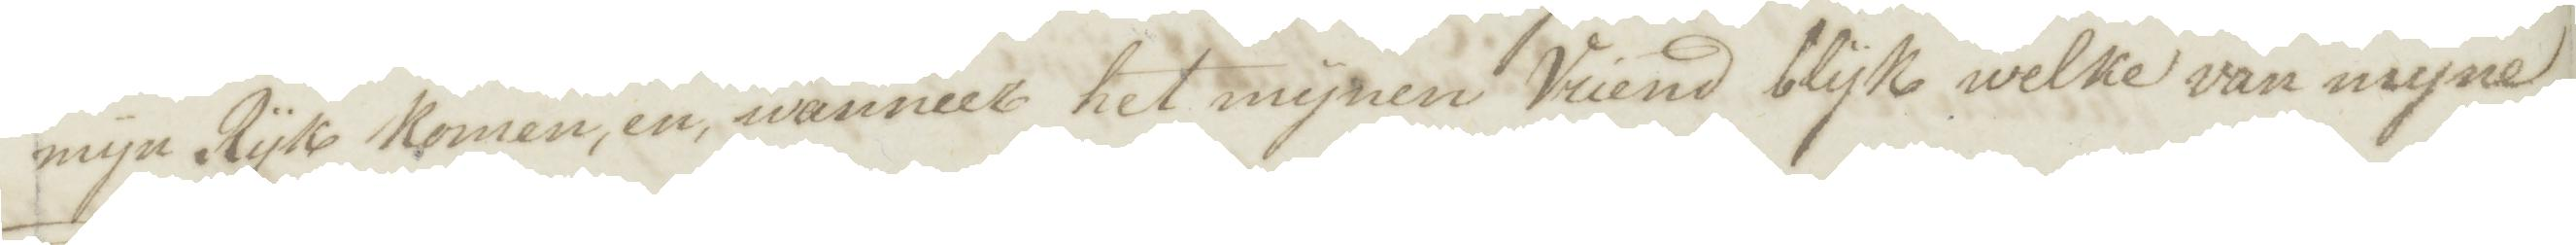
mijn Rijk komen, en, wanneer het mijnen Vriend blijk welke van mijne
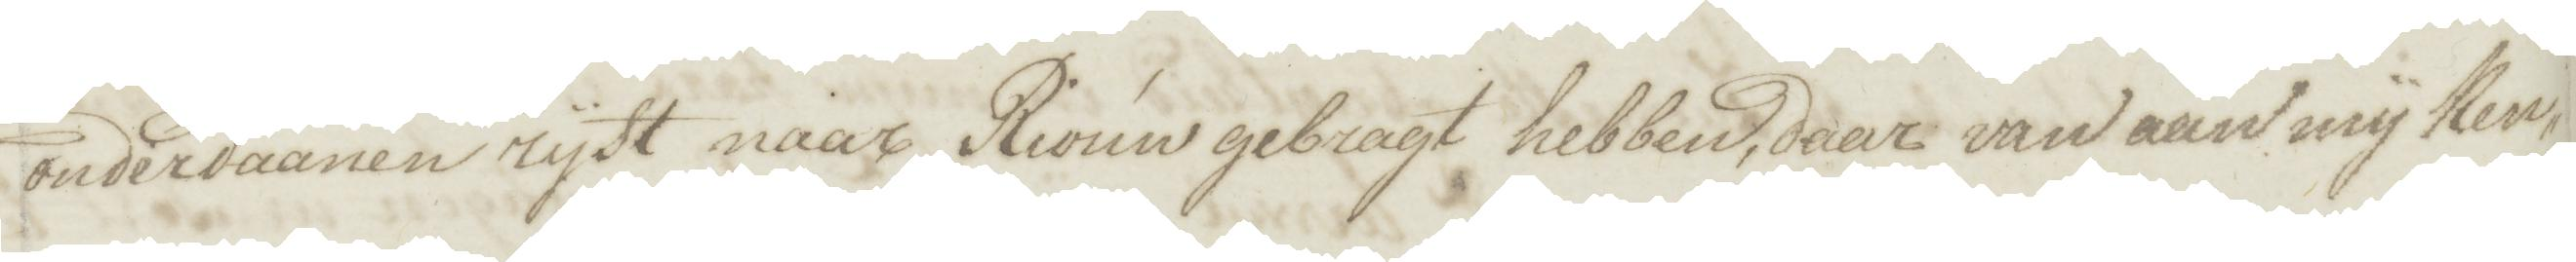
onderdaanen rijst naar Riouw gebragt hebben, daar van aan mij ken„
